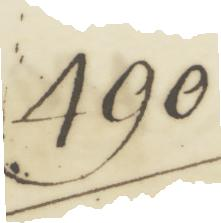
490
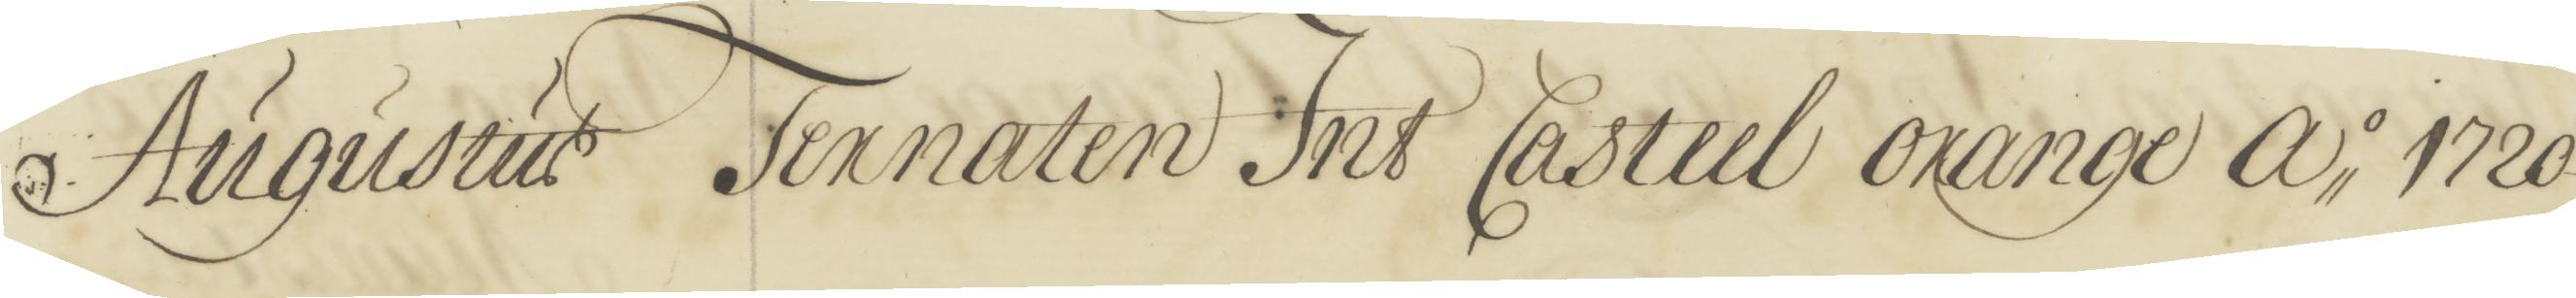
Augustus Ternaten Int Casteel orange a„o 1720
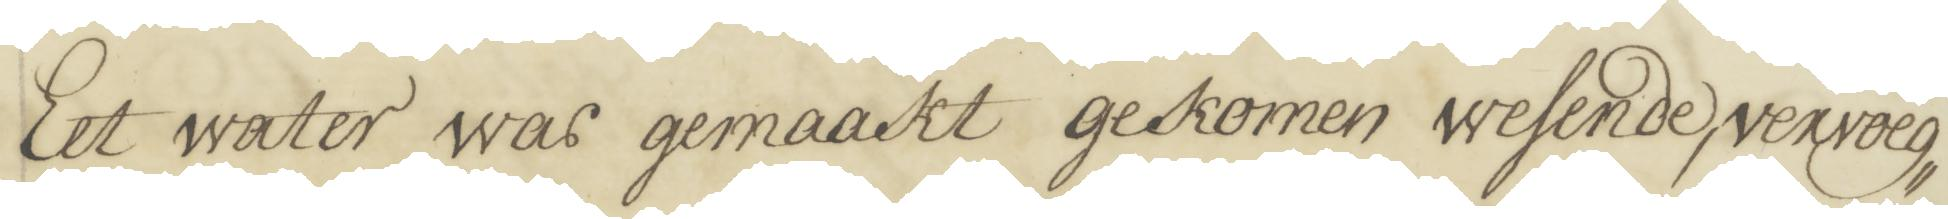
het water was gemaakt gekomen wesende, vervoeg„
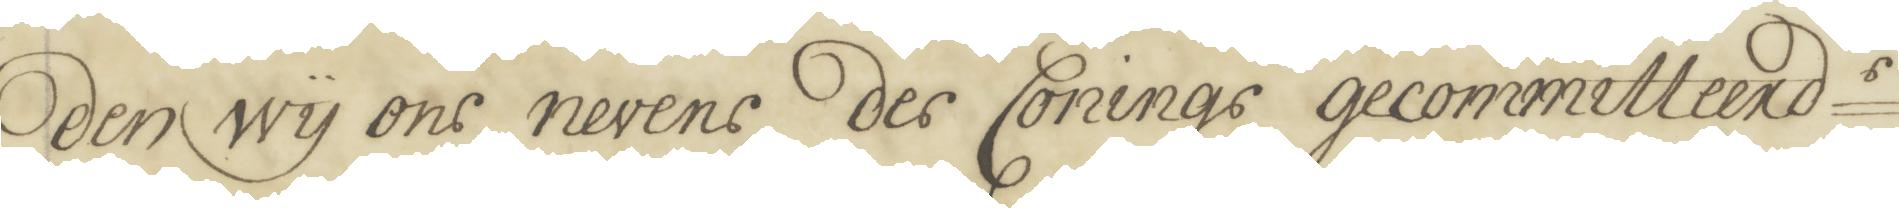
den wij ons nevens des Conings gecommitteerd=s
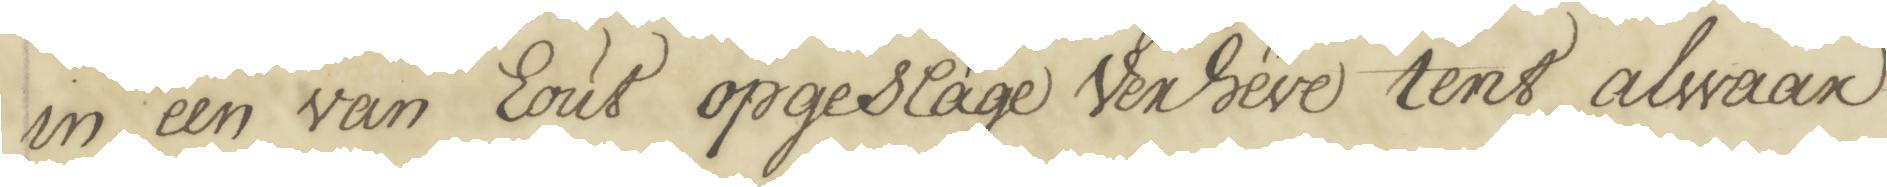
in een van hout opgeslage verheve tent alwaar
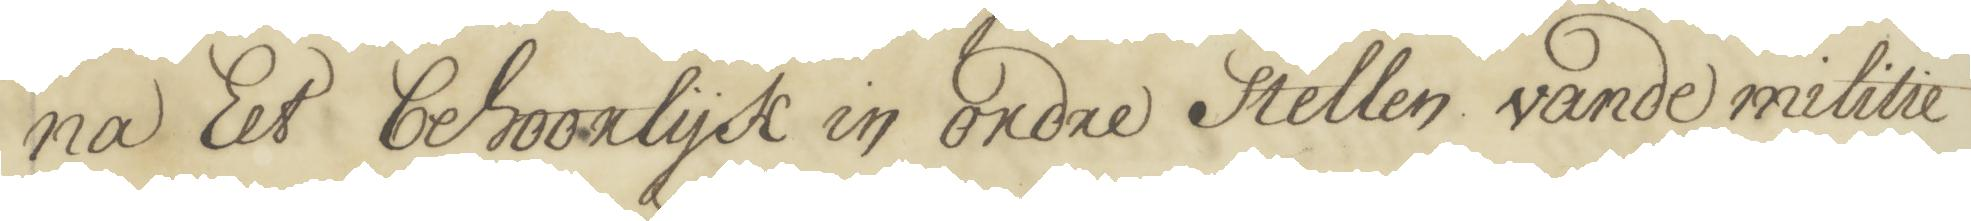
na het behoorlijk in ordre stellen vande militie
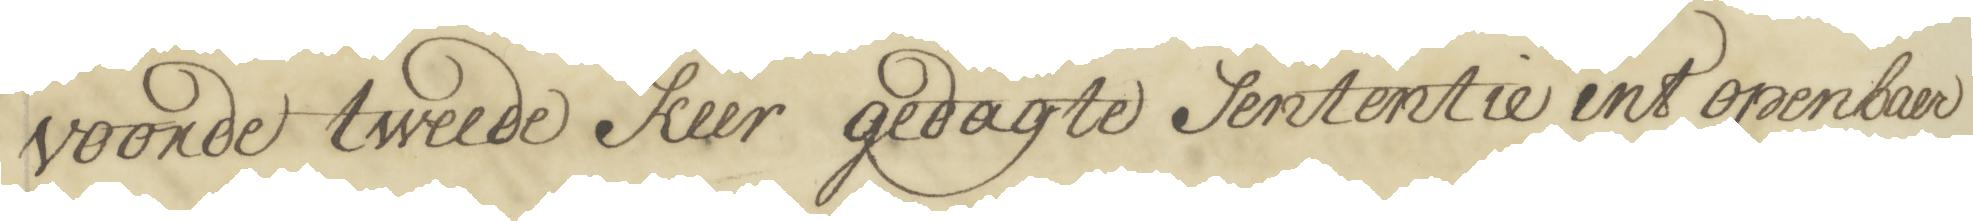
voorde tweede keer gedagte sententie in’t openbaer
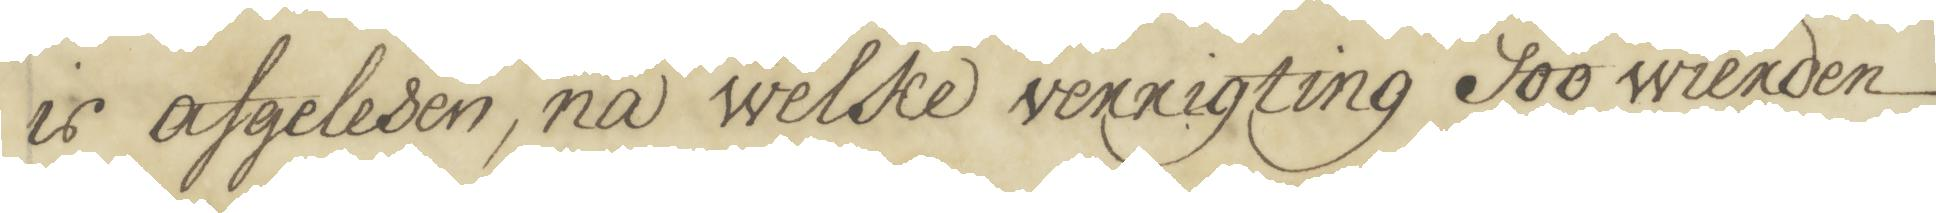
is afgelesen, na welke verrigting soo wierden
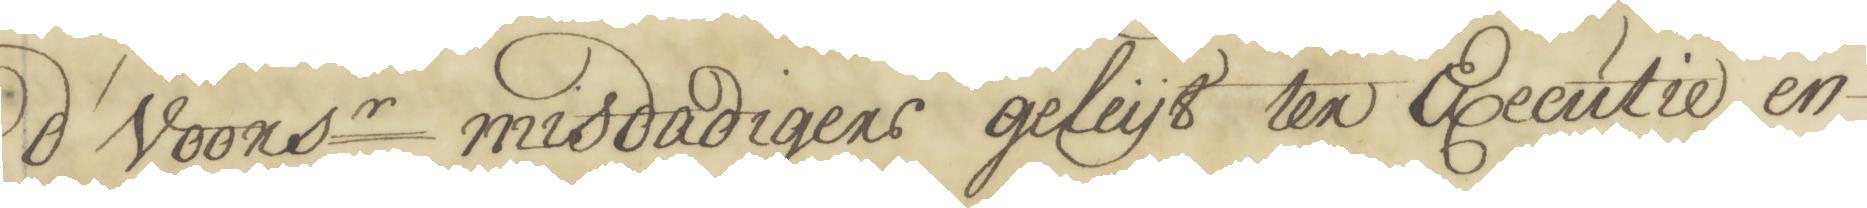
d’ Voors=r misdadigers geleijt ter Executie en
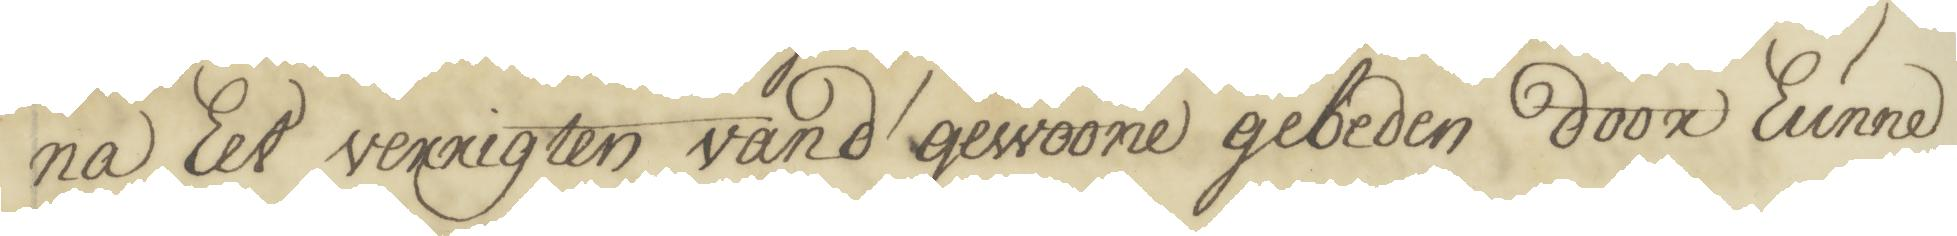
na het verrigten vand’ gewoone gebeden door hunne
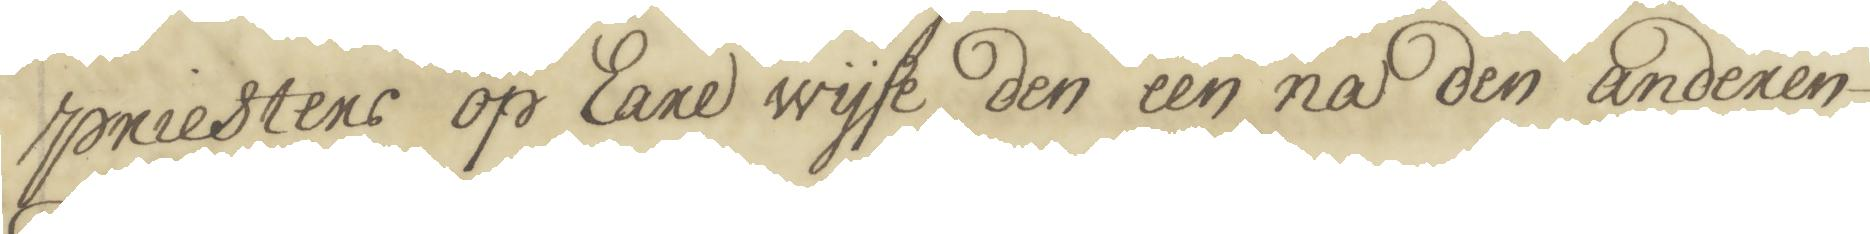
priesters op hare wijse den een na den anderen
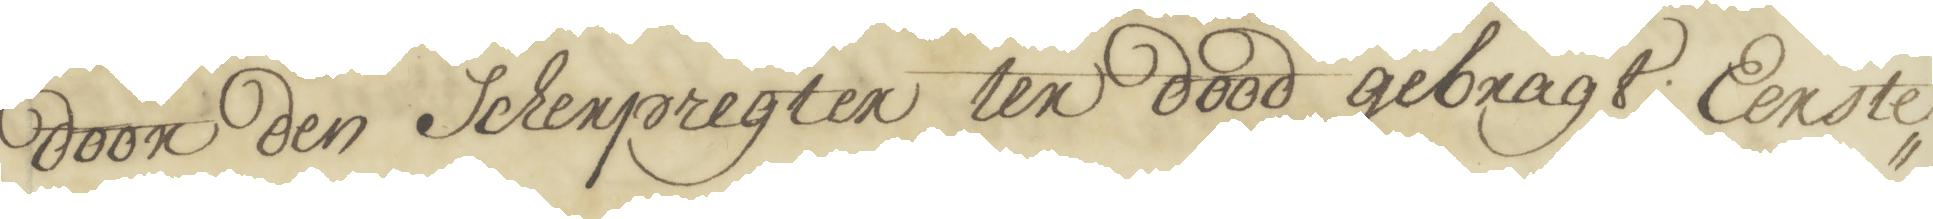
door den Scherpregter ter dood gebragt; Eerste„
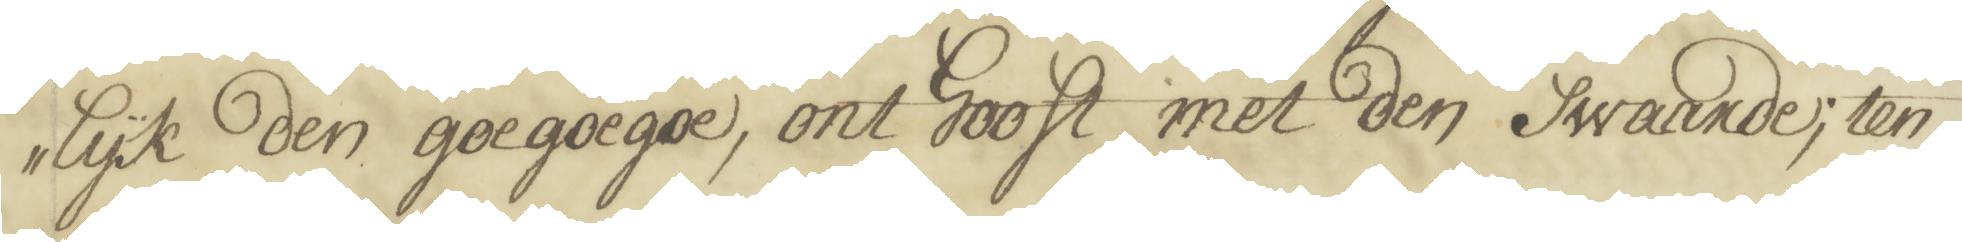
„lijk den goegoegoe, ont hooft met den swaarde; ten
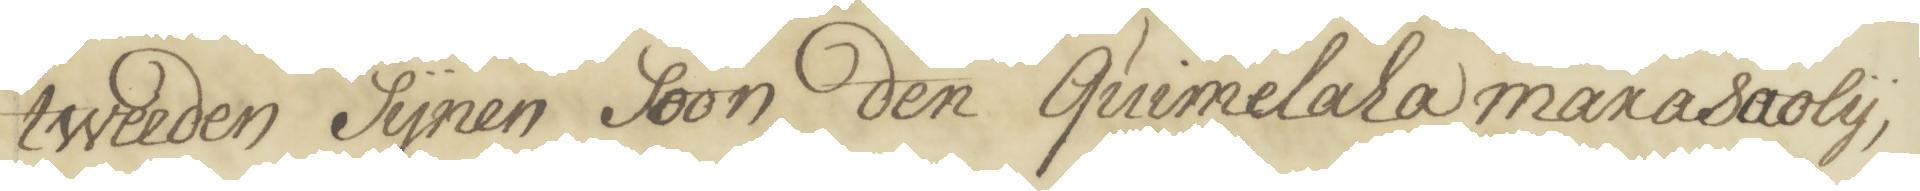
tweeden sijnen soon den Guimelaha marasaolij„
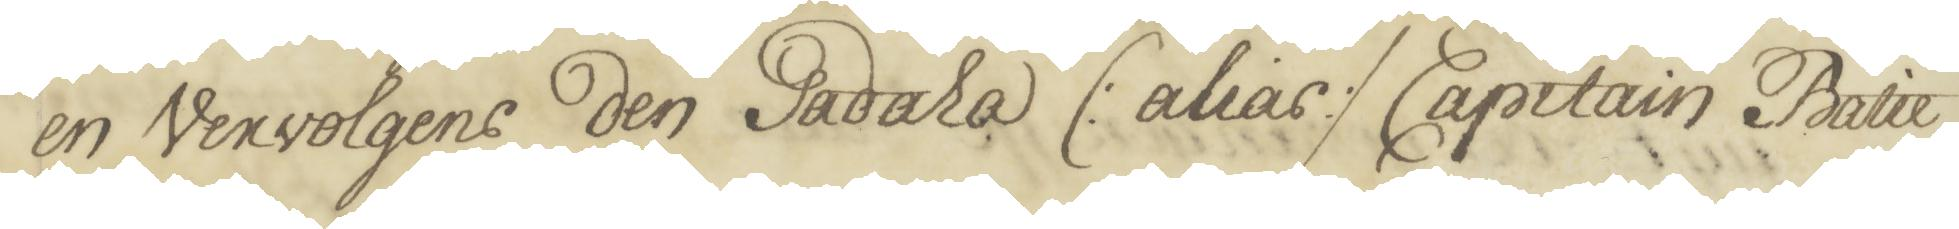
en Vervolgens den Padaha (:alias:/ Capitain Batie,
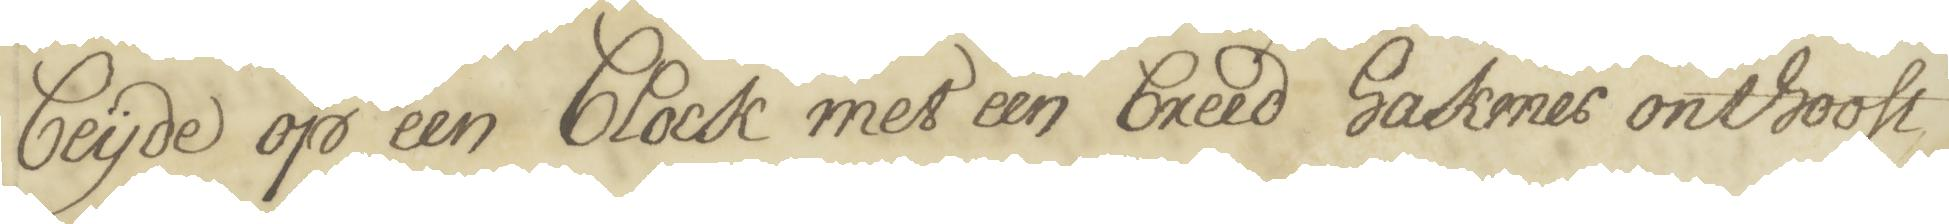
beijde op een block met een breed haknes onthooft,
